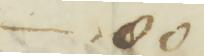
-.80
